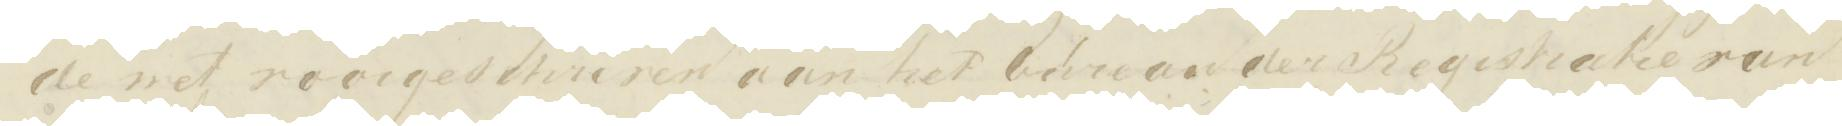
de wet voorgeschreven aan het bureau der Registratie van
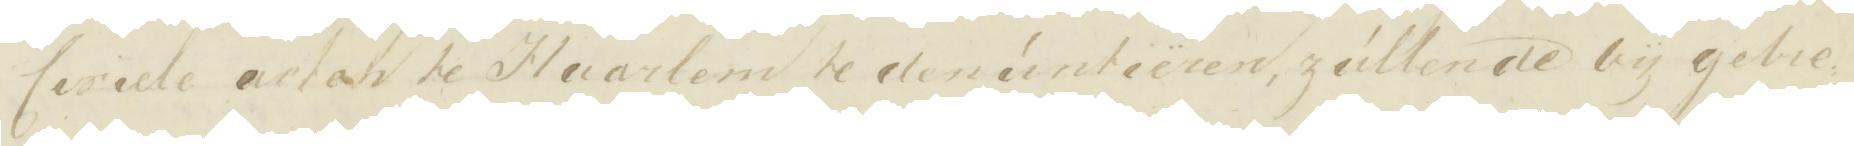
Civile acten te Haarlem te denuntieren, zullen de bij gebre„
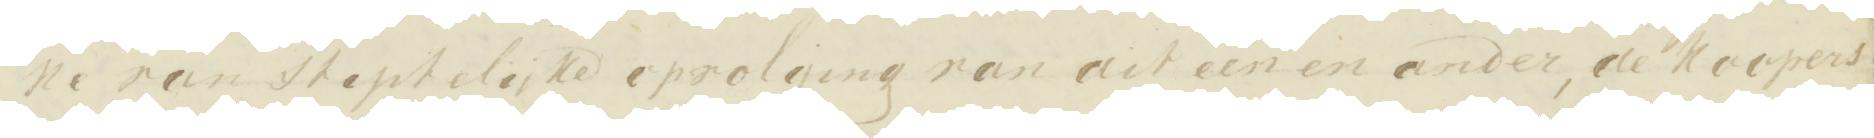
ke van stiptelijke opvolging van dit een en ander, de Koopers
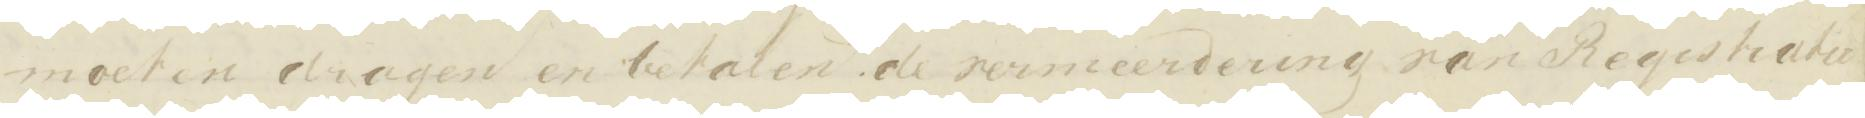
moeten dragen en betalen de vermeerdering van Registratie
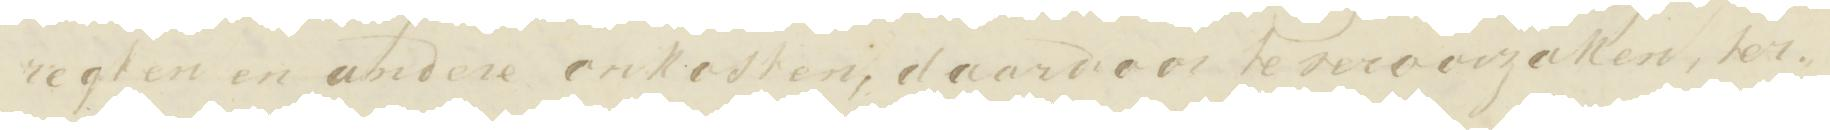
regten en andere onkosten, daardoor te veroorzaken, ter„
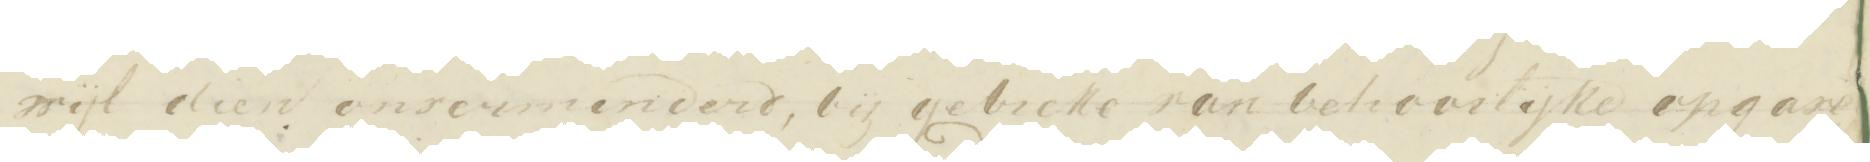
wijl dien onverminderd, bij gebreke van behoorlyke opgave
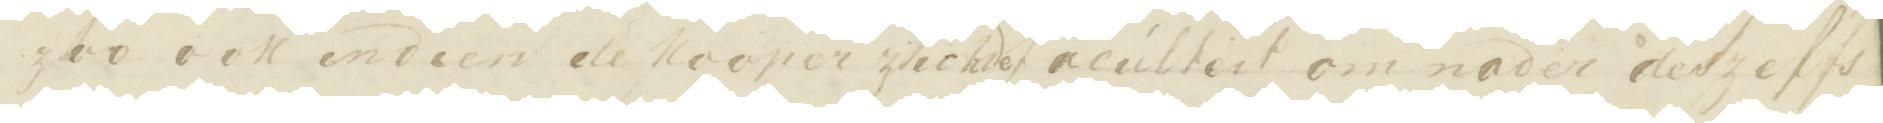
zoo ook indien de kooper zich de faculteit om nader deszelfs
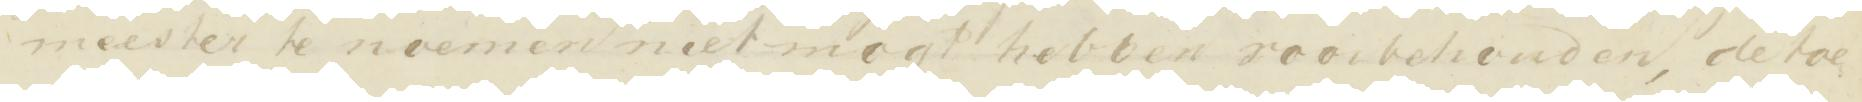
meester te noemen niet mogt hebben voorbehouden, de toe
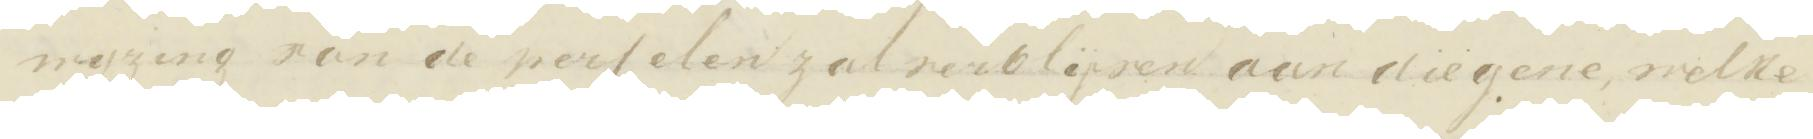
wyzing van de percelen zal verblijven aan diegene, welke
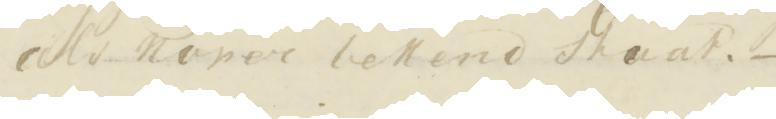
als koper bekend staat.
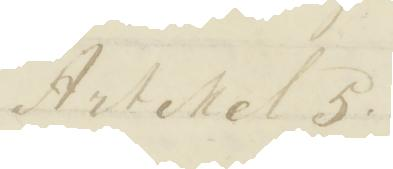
Artikel 5.
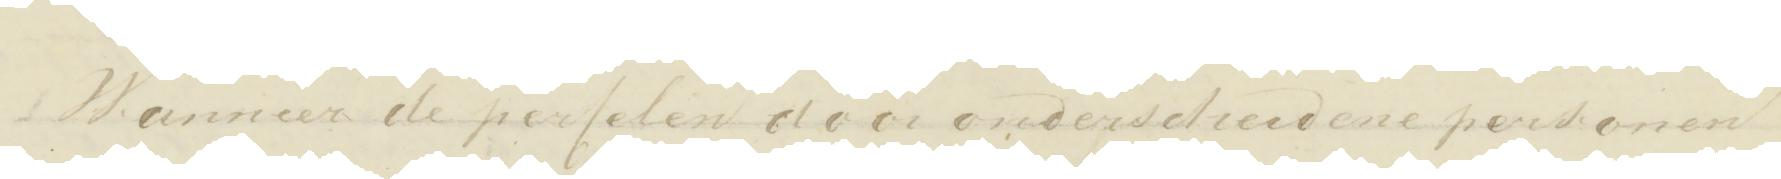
Wanneer de percelen door onderscheidene personen
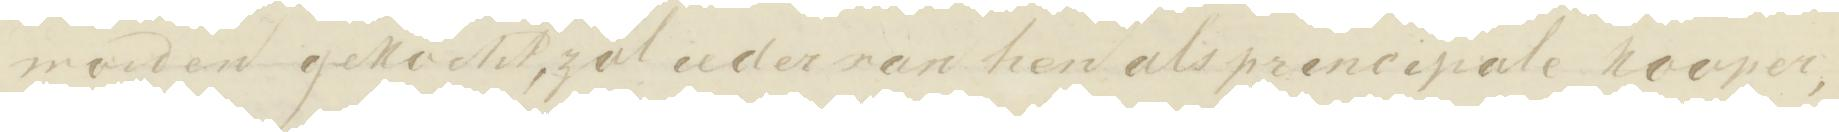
worden gekocht, zal ieder van hen als principale kooper,
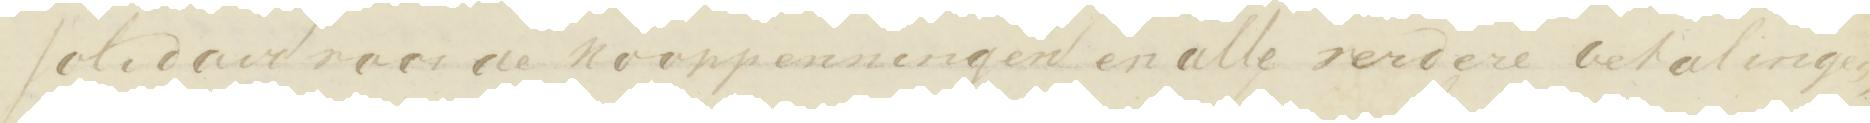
solidair voor de kooppenningen en alle verdere betalingen
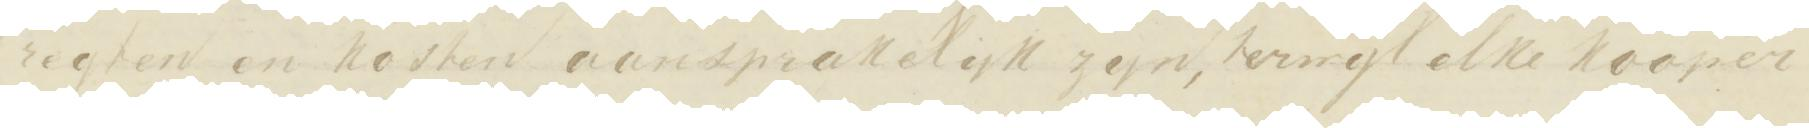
regten en kosten aansprakelijk zyn, terwyl elke kooper
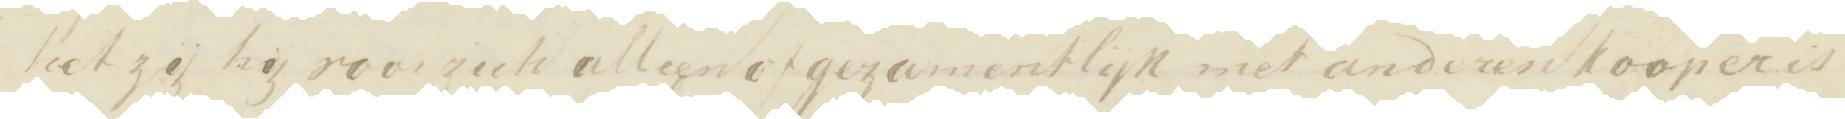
hetzij hij voor zich alleen of gezamentlijk met anderen kooper is
